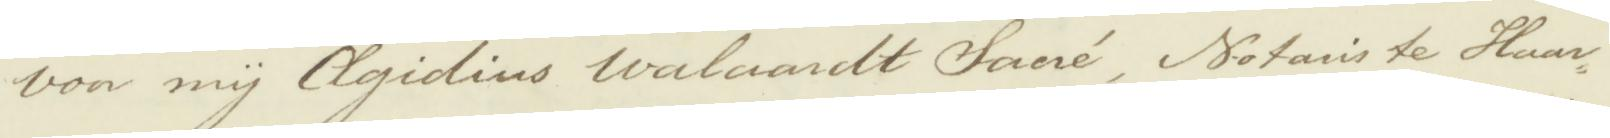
voor mij AEgidius Walaardt Sacré, Notaris te Haar=
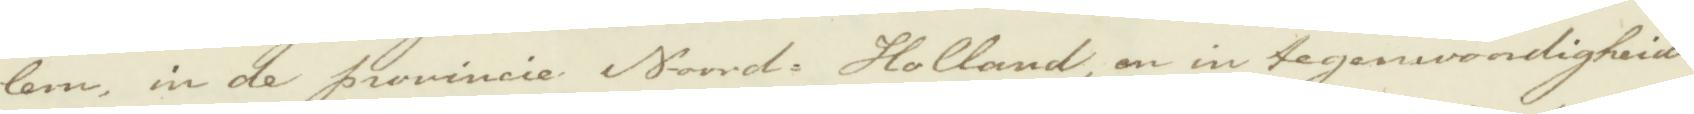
lem, in de provincie Noord= Holland, en in tegenwoordigheid
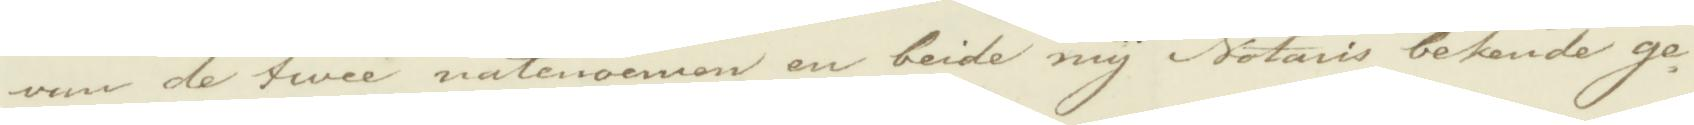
van de twee natenoemen en beide mij Notaris bekende ge=
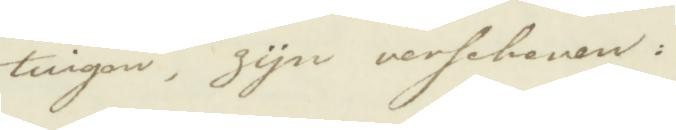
tuigen, zijn verschenen:
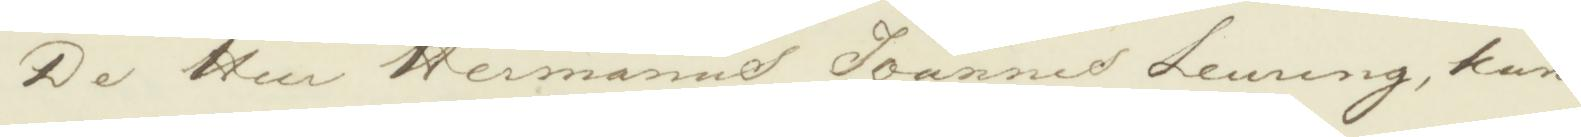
De Heer Hermanus Ioannes Leuring, kan
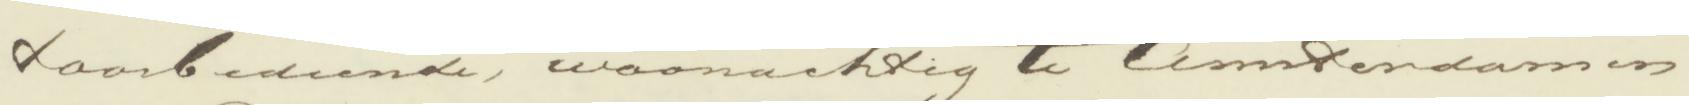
toorbediende, woonachtig te Amsterdam in
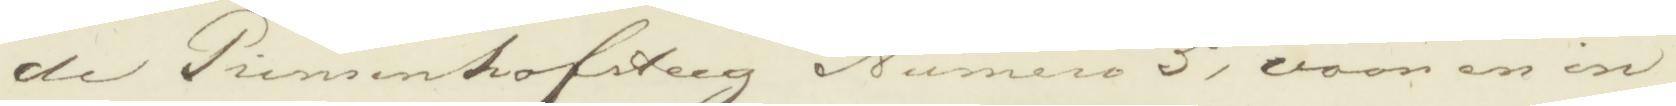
de Prinsenhofsteeg Numero 5, voor en in
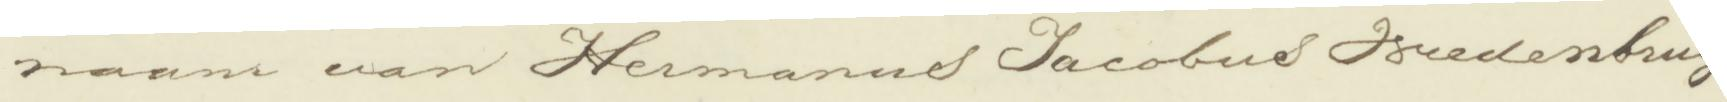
naam van Hermanus Iacobus Wiedenbrug
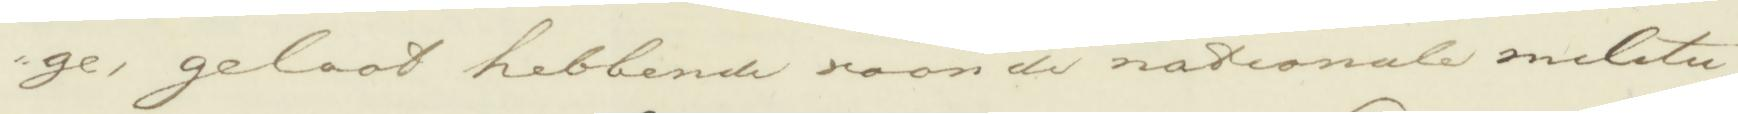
„ge, geloot hebbende voor de nationale militie
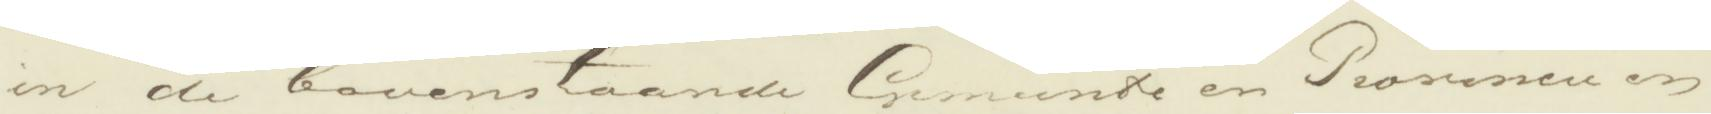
in de bovenstaande Gemeende en Provincie en
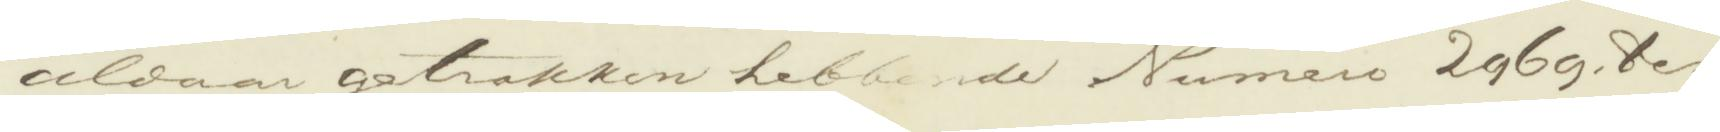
aldaar getrokken hebbende Numero 2969. ter
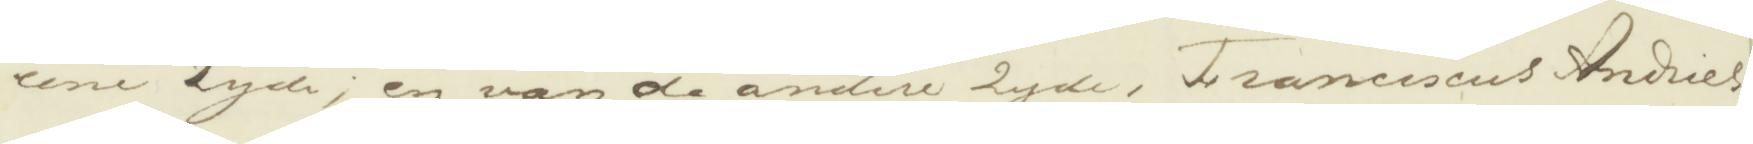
eene zyde; en van de andere zyde, Franciscus Andries
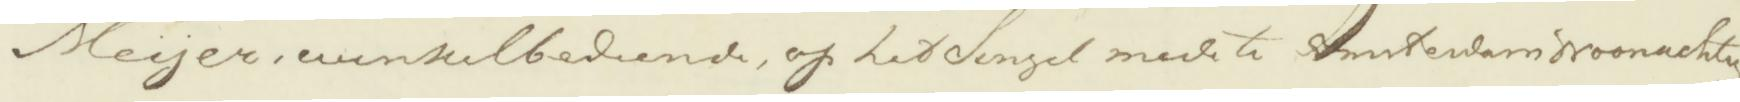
Meijer, winkelbediende, op het Singel mede te Amsterdam woonachtig
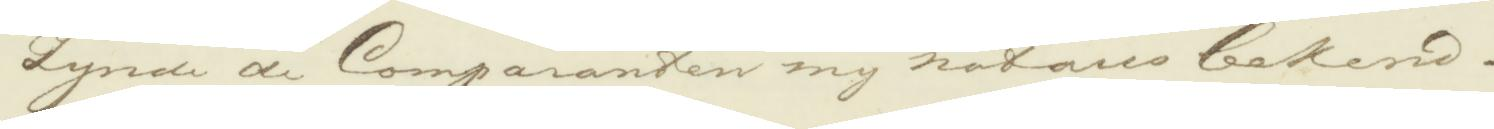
Zynde de Comparanten my notaris bekend
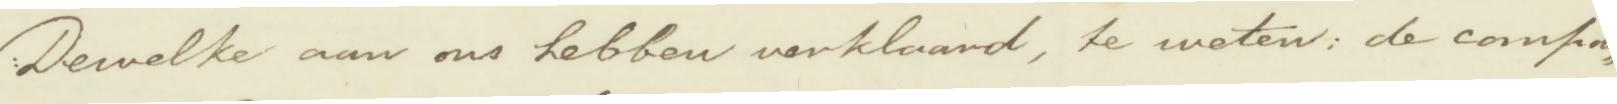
Dewelke aan ons hebben verklaard, te weten: de compa„
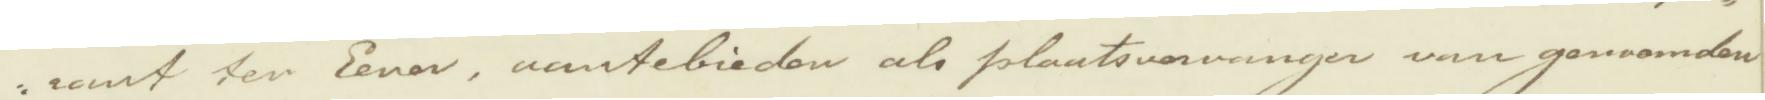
„rant ten Eener, aantebieden als plaatsvervanger van genoemden
